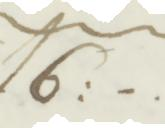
ƒ6 : - :
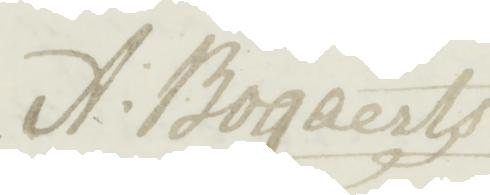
A: Bogaerts
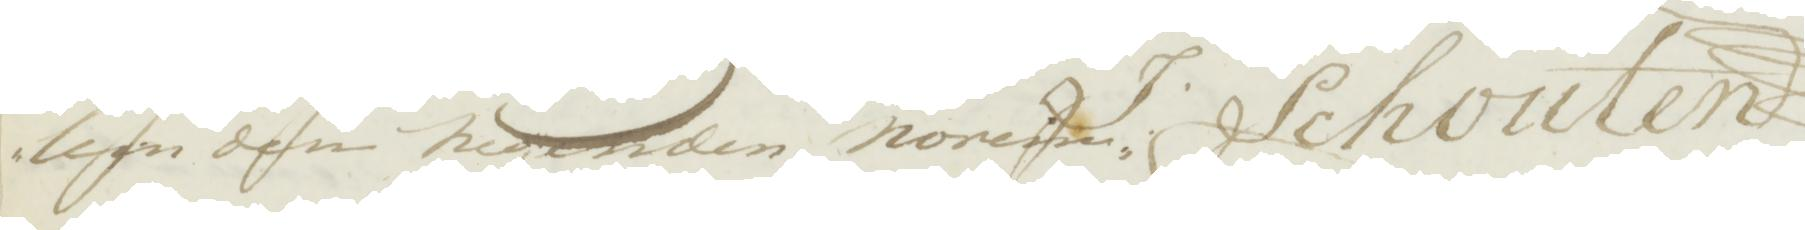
„lem den negenden novem„ J. Schouten
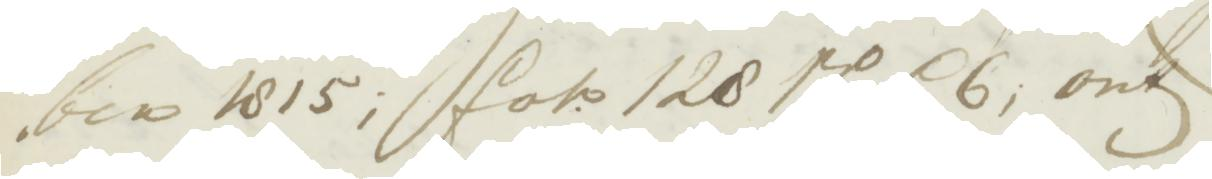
„ber 1815, fol.o 128 N=o 6; ont
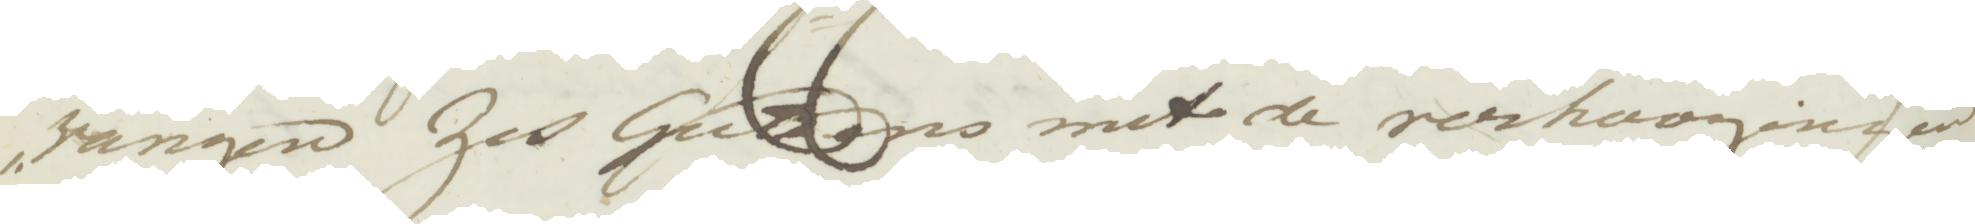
„vangen zes guldens met de verhoogingen
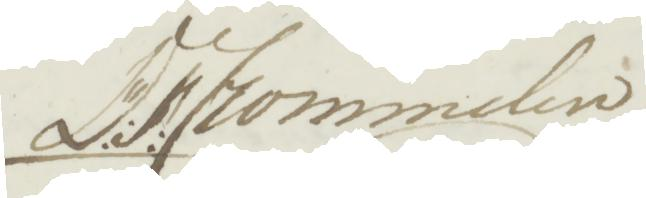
D: I: Crommelin
